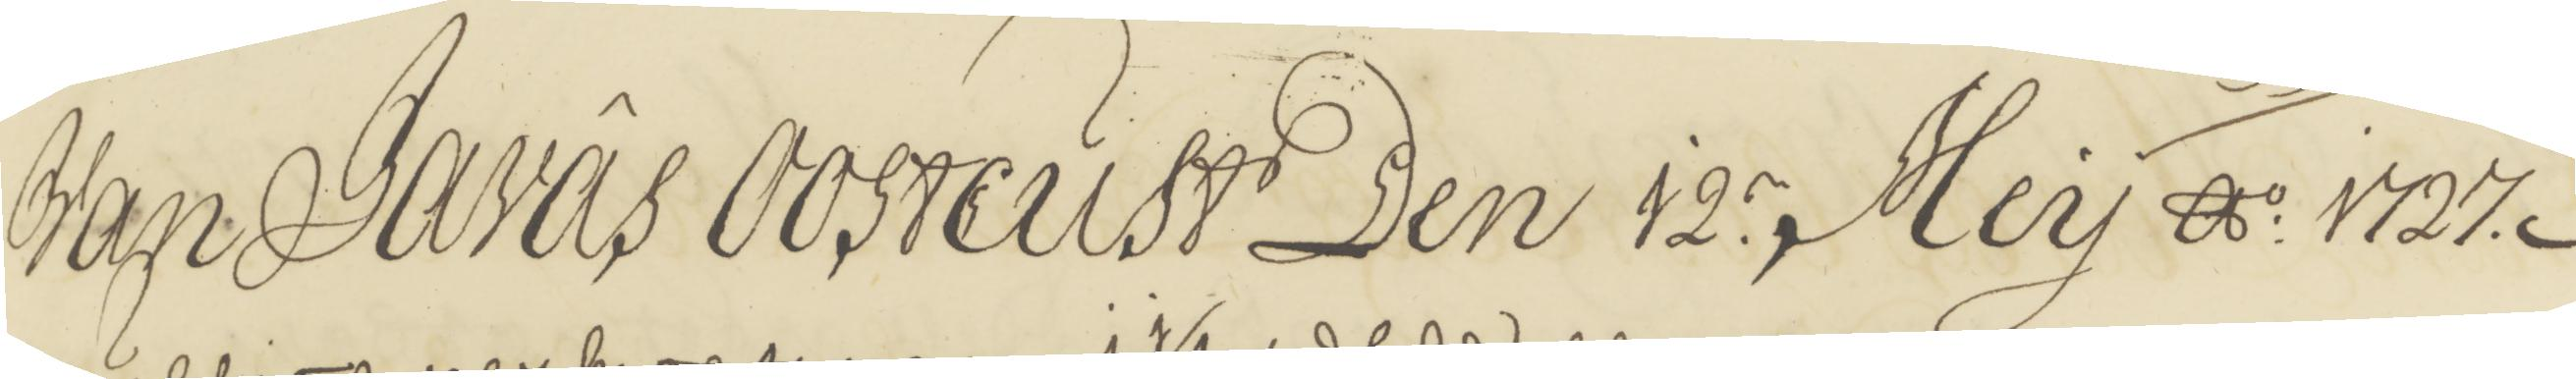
Van Iavâs Oostcust Den 12:e Meij A:o 1727. —
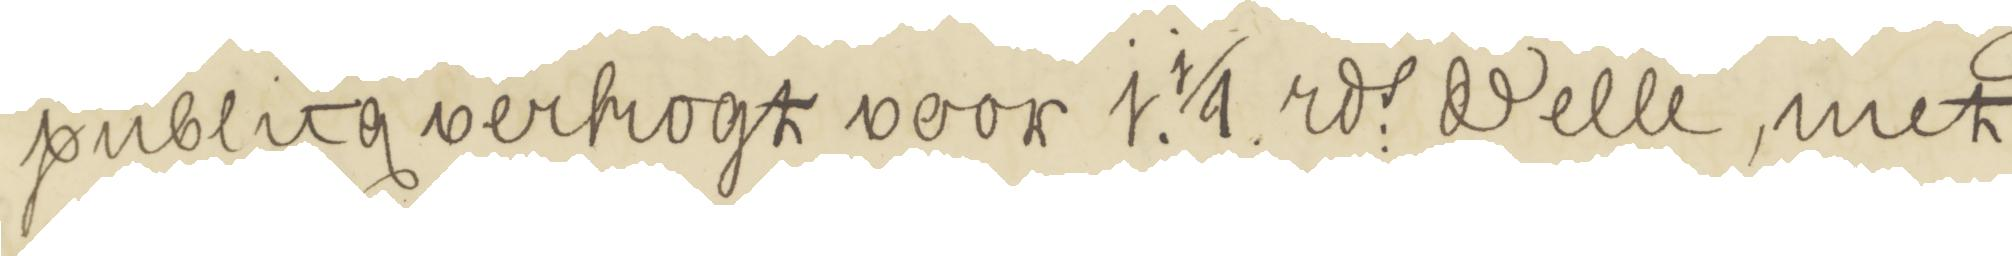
publicq verkogt voor 1.1/4 rd:s de elle, met
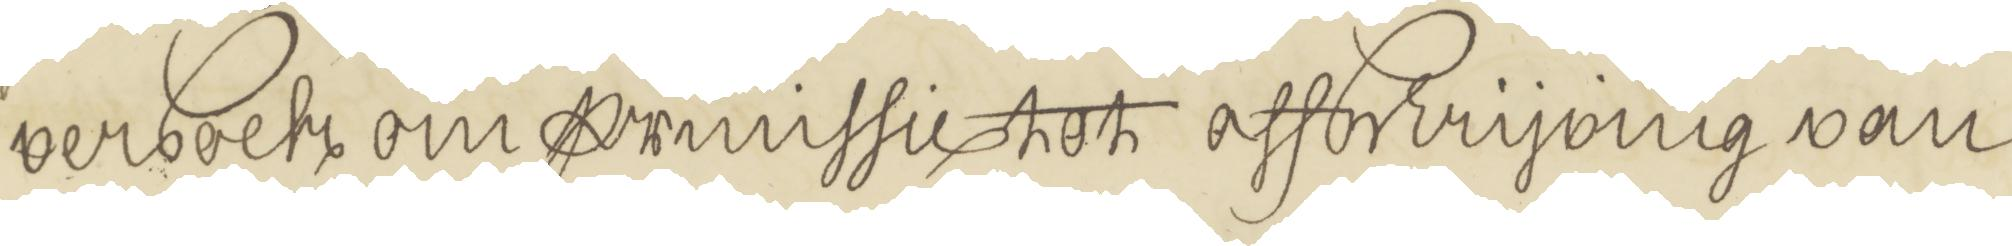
versoek om permissie tot affschrijving van
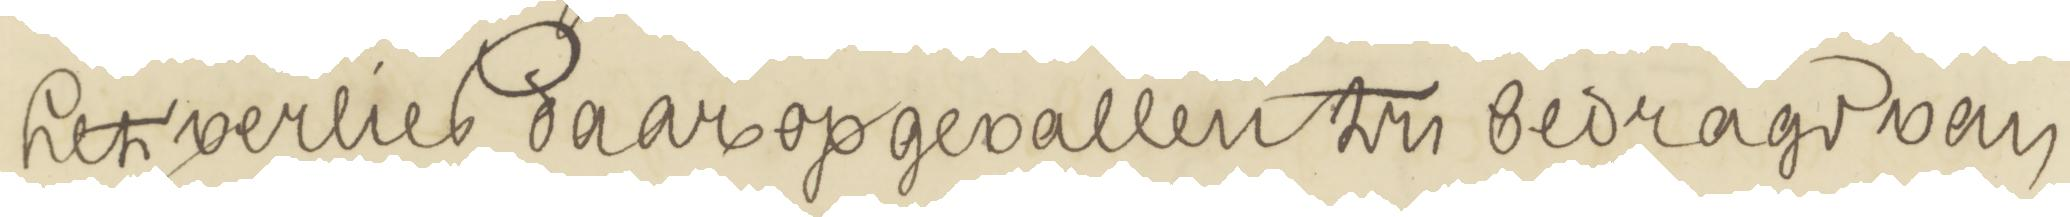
het verlies daar op gevallen ten bedrage van
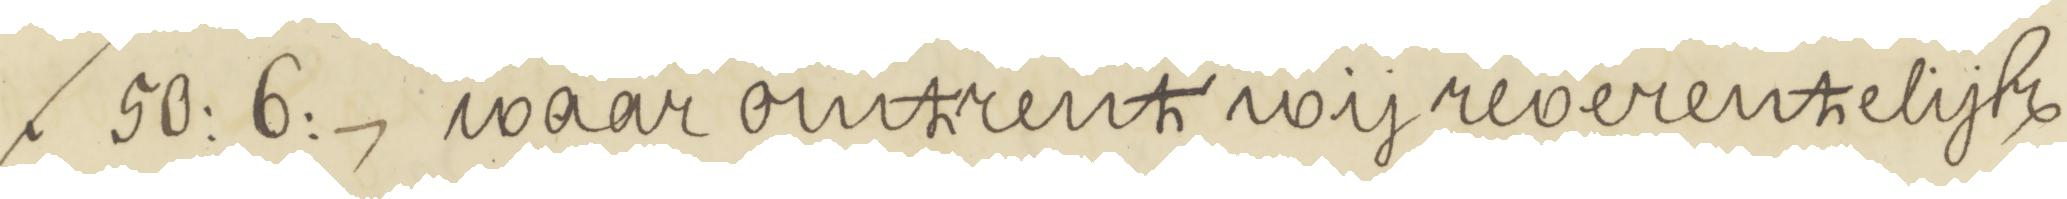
ƒ 50: 6:— waar omtrent wij reverentelijk
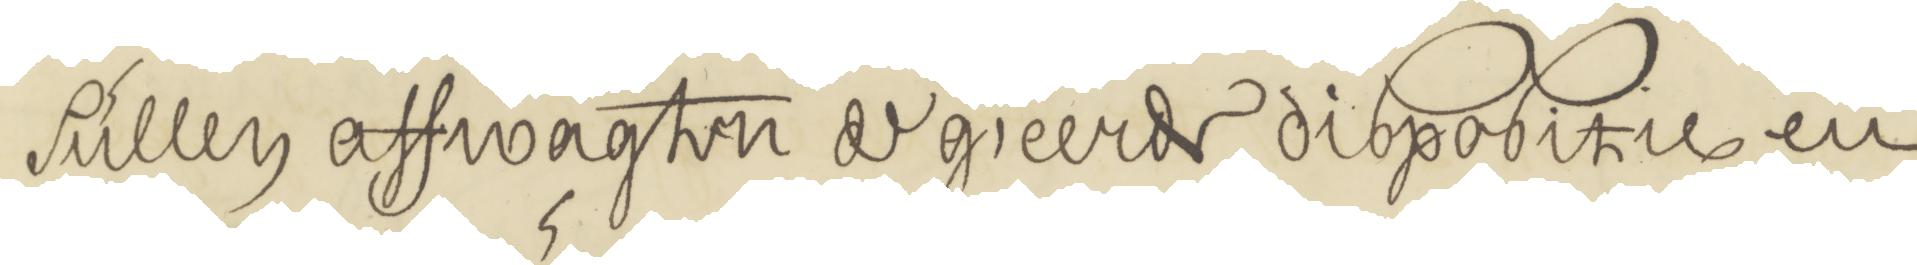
sullen affwagten de g'eerde dispositie en
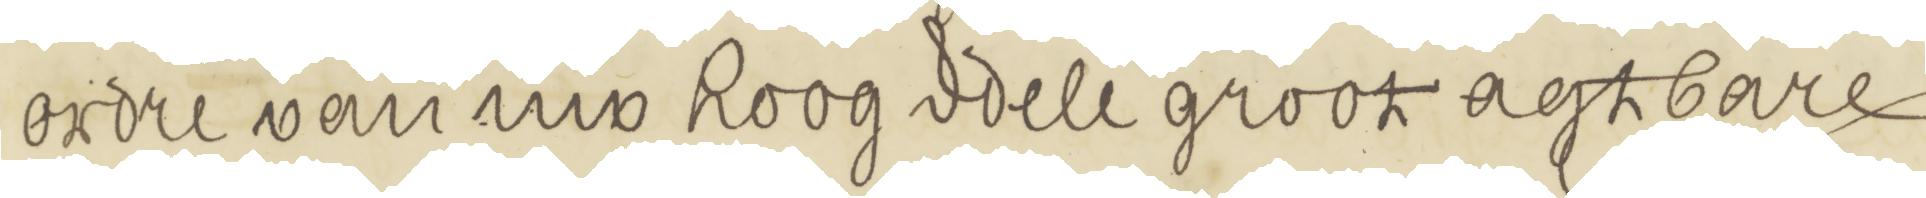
ordre van uw hoog edele groot agtbare,
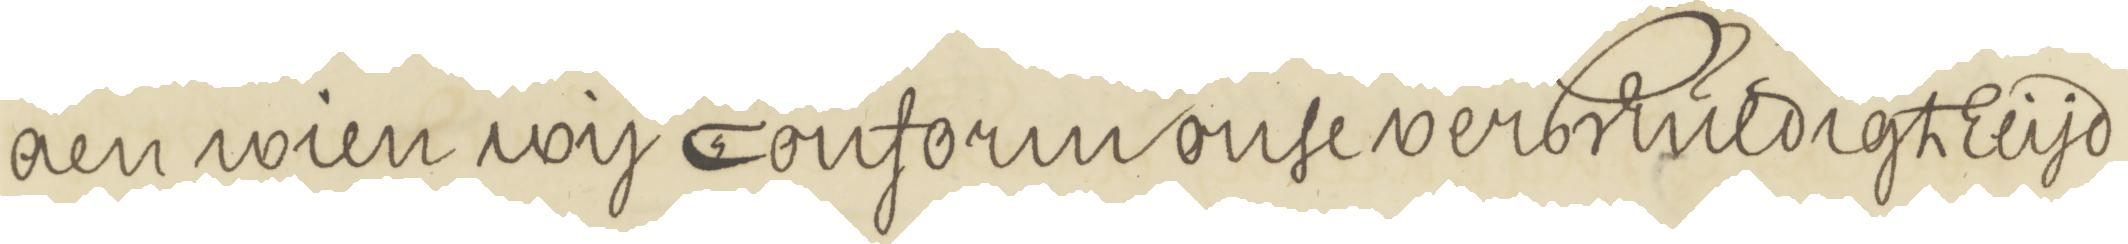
aen wien wij conform onse verschuldigtheijd
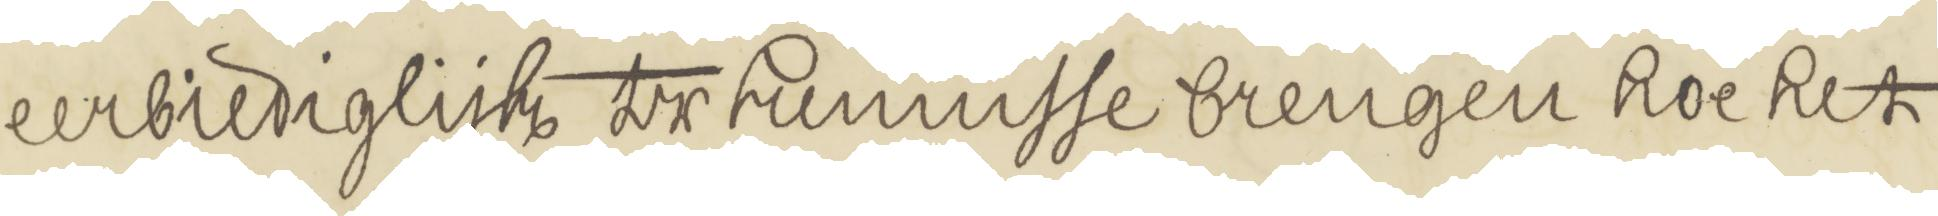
eerbiediglijk ter kennisse brengen hoe het
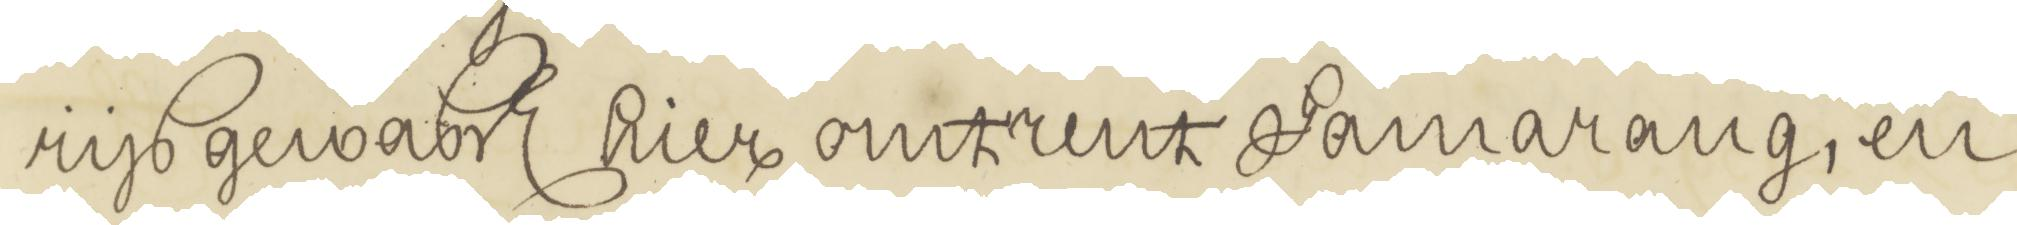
rijs gewasch hier omtrent Samarang, en
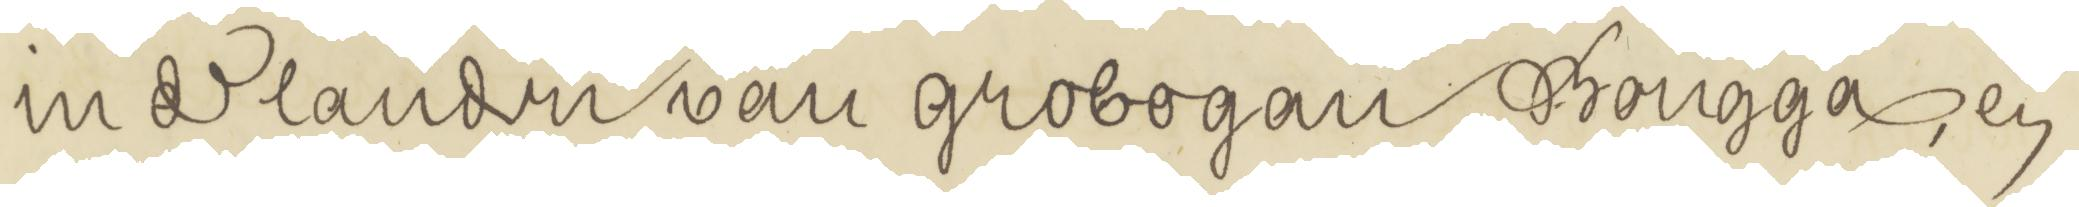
in de landen van grobogan, Bongga, en
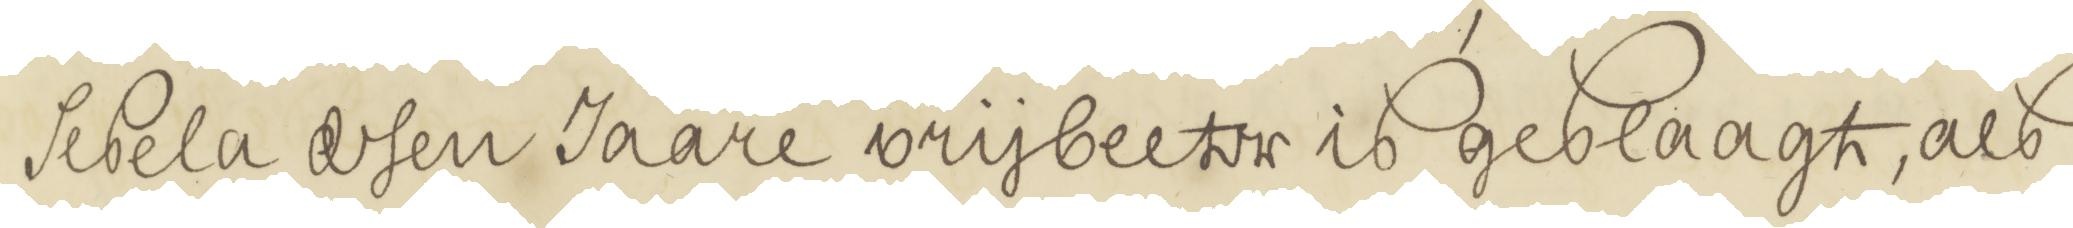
sebela desen Iare vrijbeeter is geslaagt, als
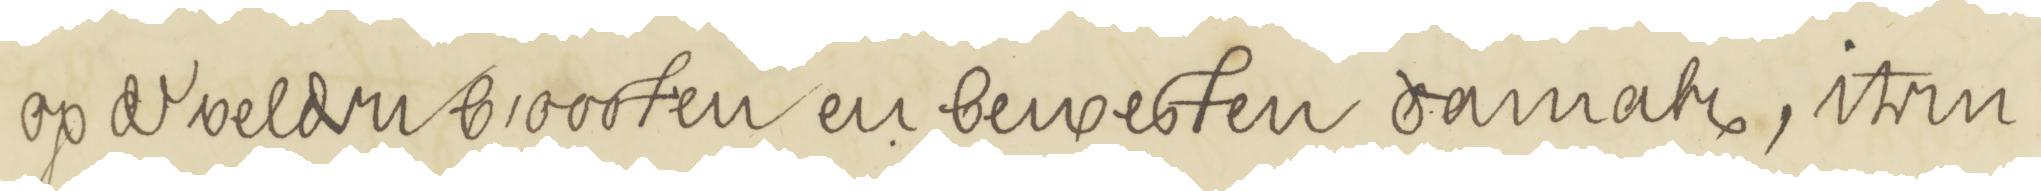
op de velden b'oosten en bewesten damak, item
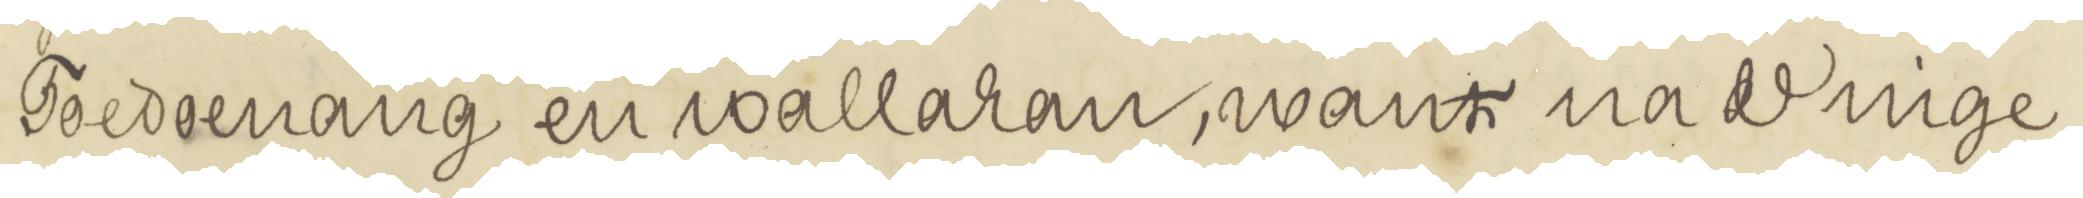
Toedoenang en wallahan, want na de inge
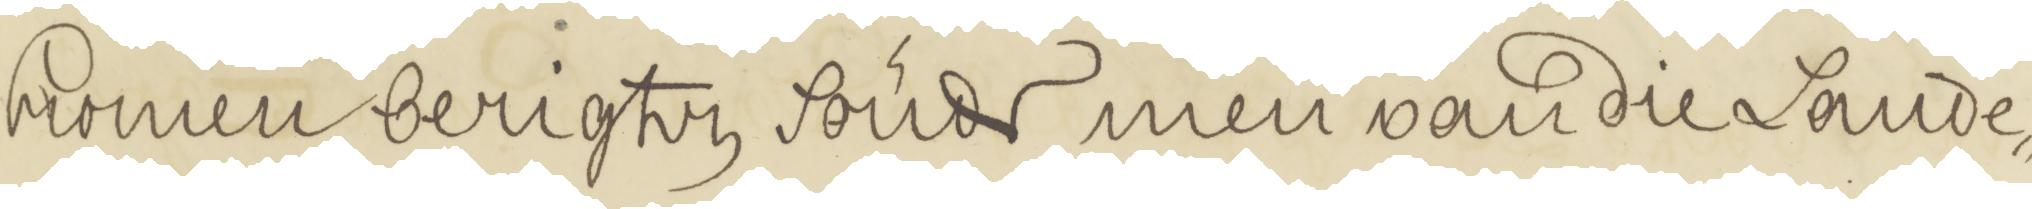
komen berigten soude men van die lande„
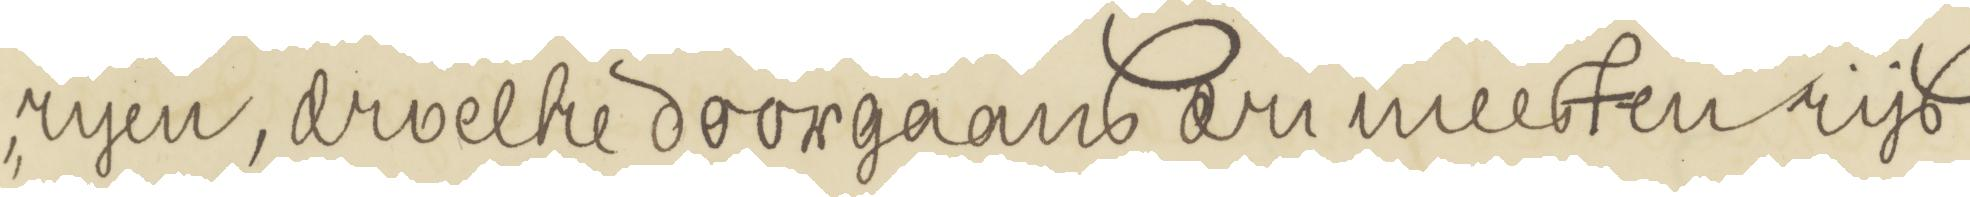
„rijen, dewelke doorgaans den meesten rijs
